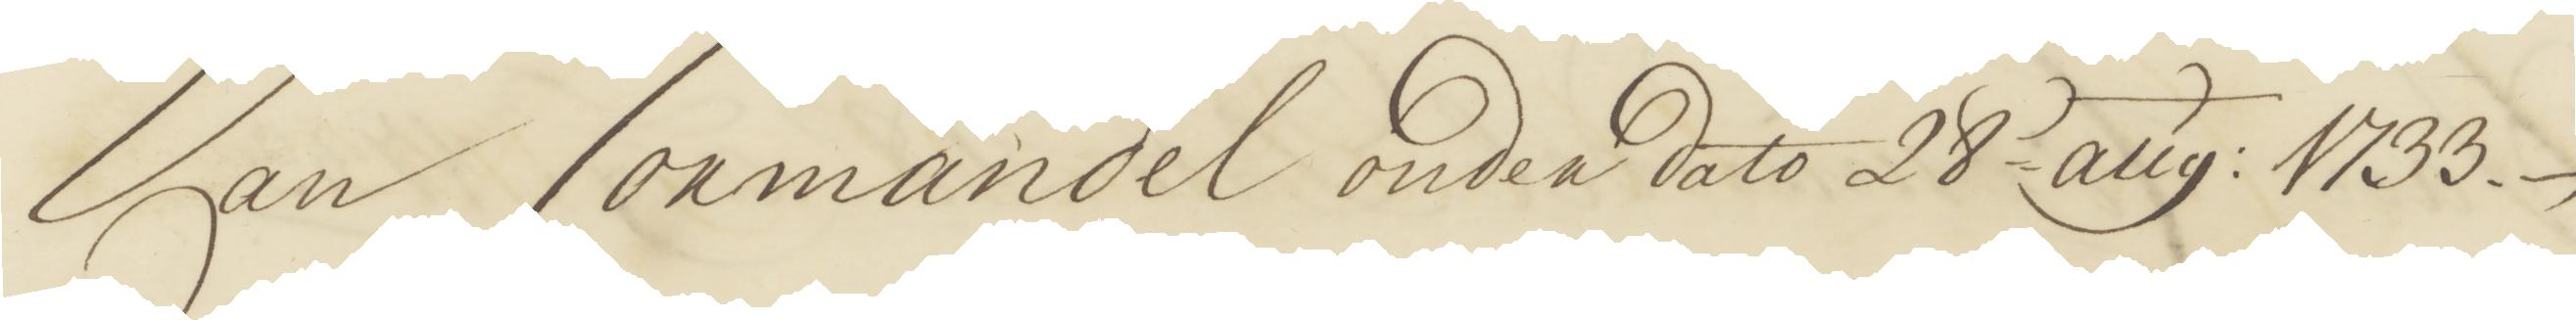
Van Cormandel onder dato 28=' aug: 1733.—
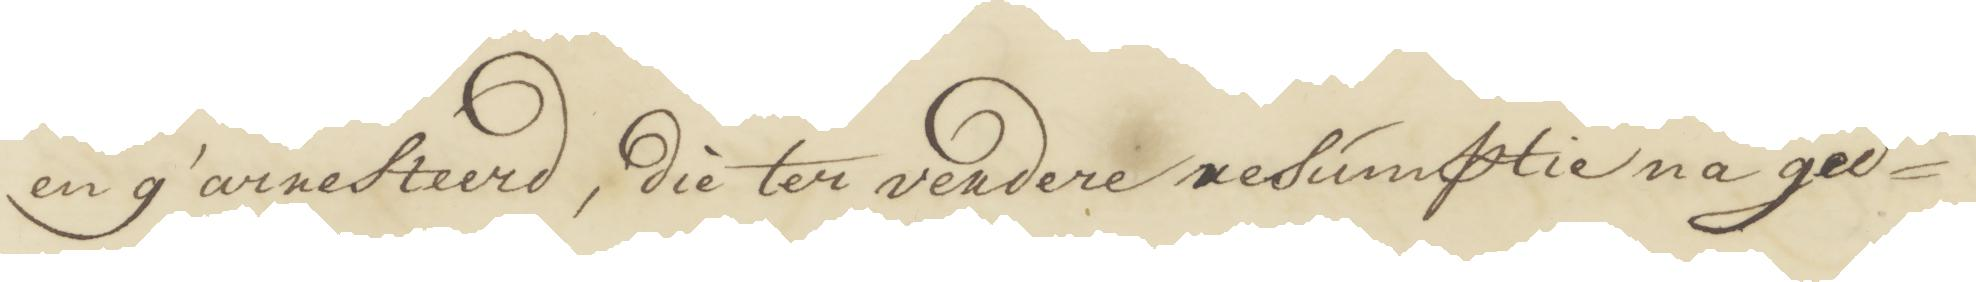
en g’arresteerd, die ter verdere resumptie na ged=te
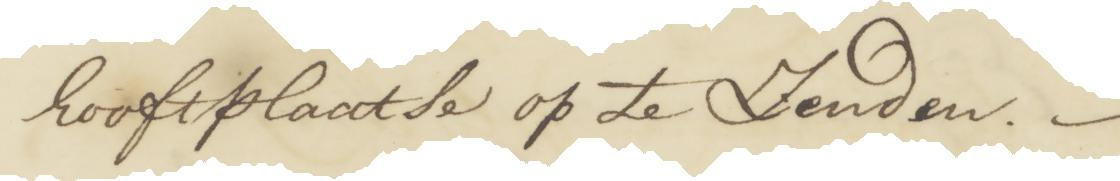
hooft plaatse op te zenden. -
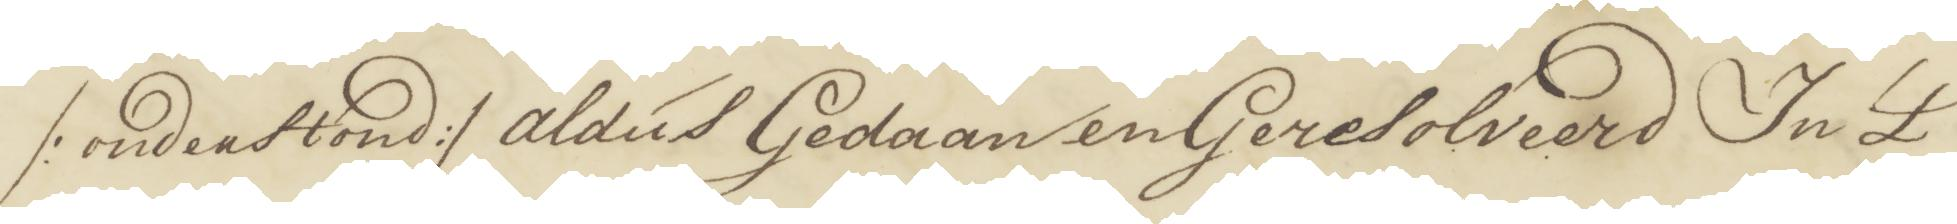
/:onderstond:/ aldus Gedaan en Geresolveerd In 't
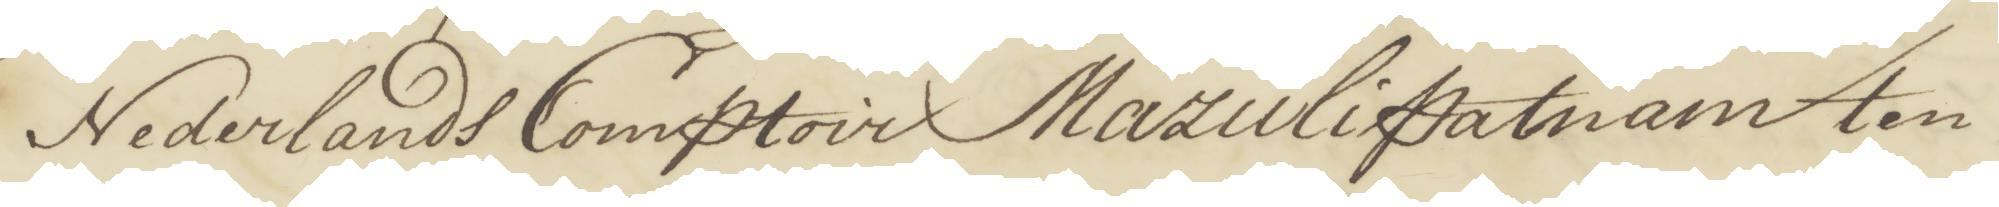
Nederlands Comptoir Mazulipatnam ten
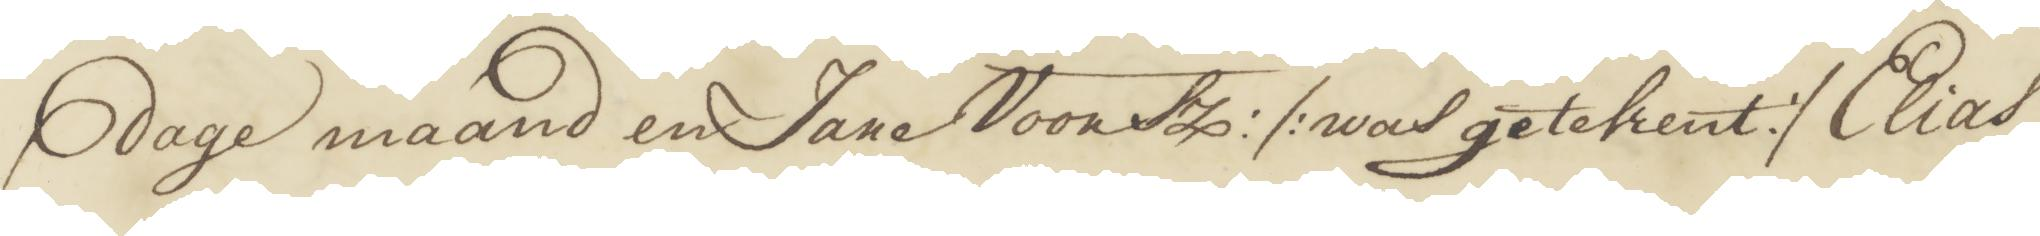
dage maand en Jare Voorsz: /:was getekent:/ Elias
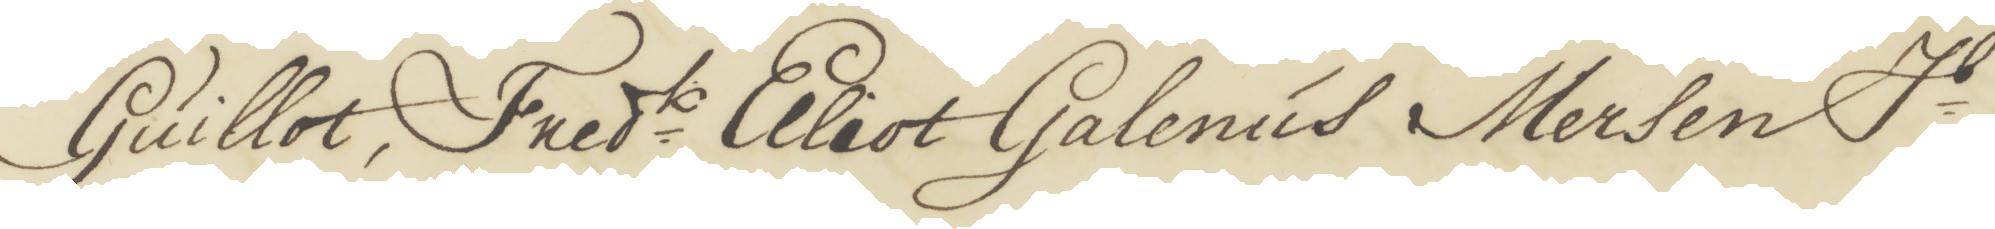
Guillot, Fred=k Elliot Galenus Mersen J=b
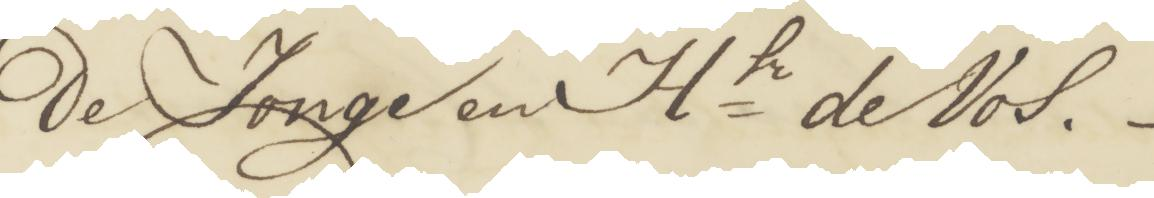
de Ionge en H=k de Vos.
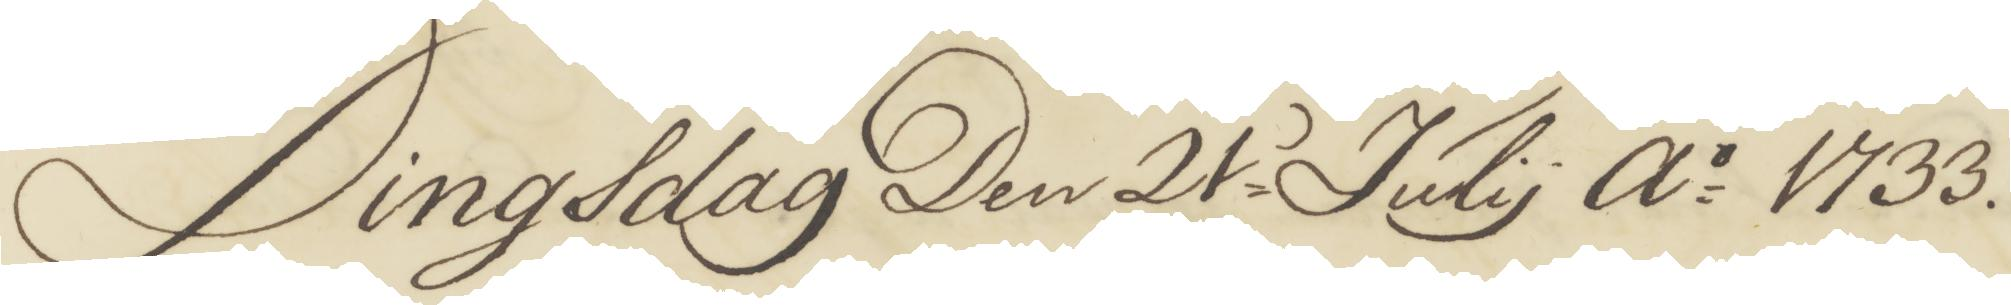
Dingsdag Den 21:' Julij A:o 1733.
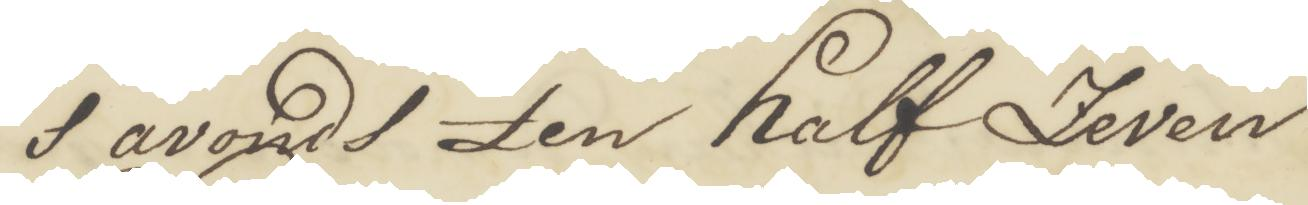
's avonds ten half zeven
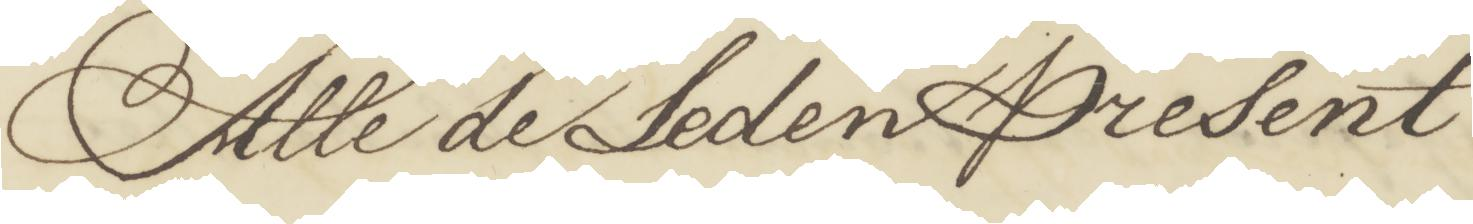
Alle de Leden present
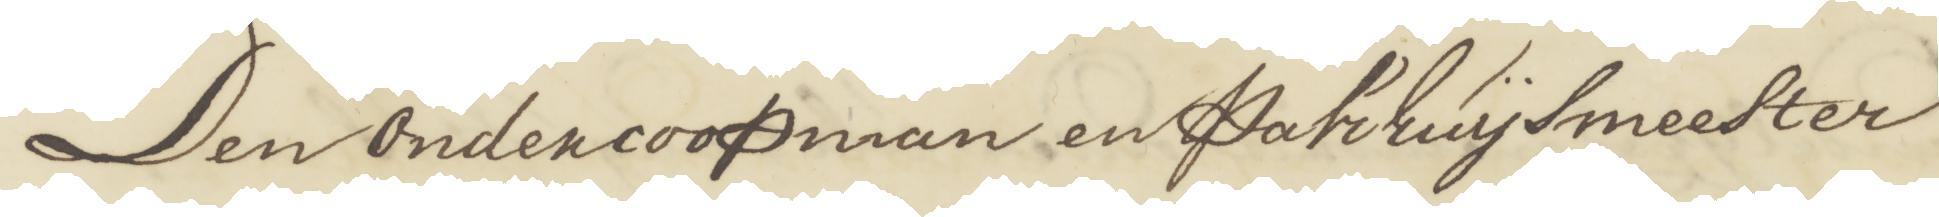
Den ondercoopman en pakhuijsmeester
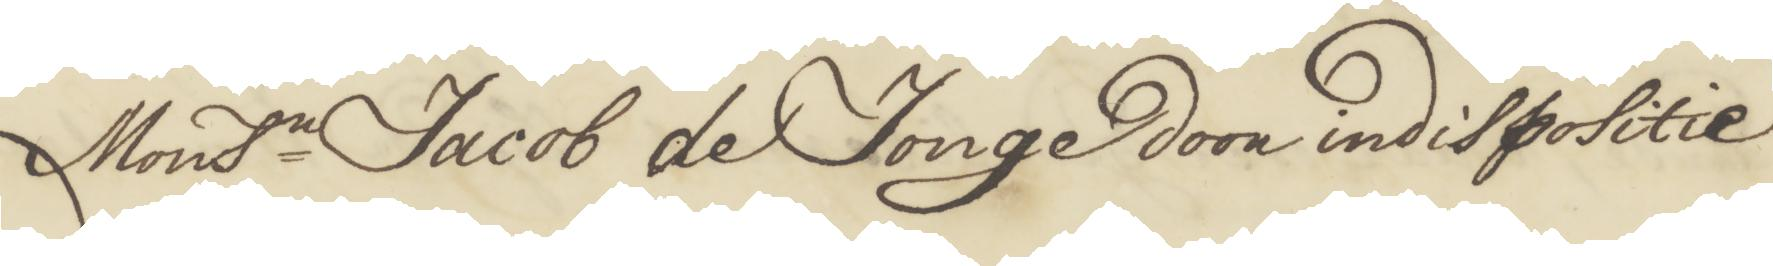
Mons=r Iacob de Ionge door indispositie
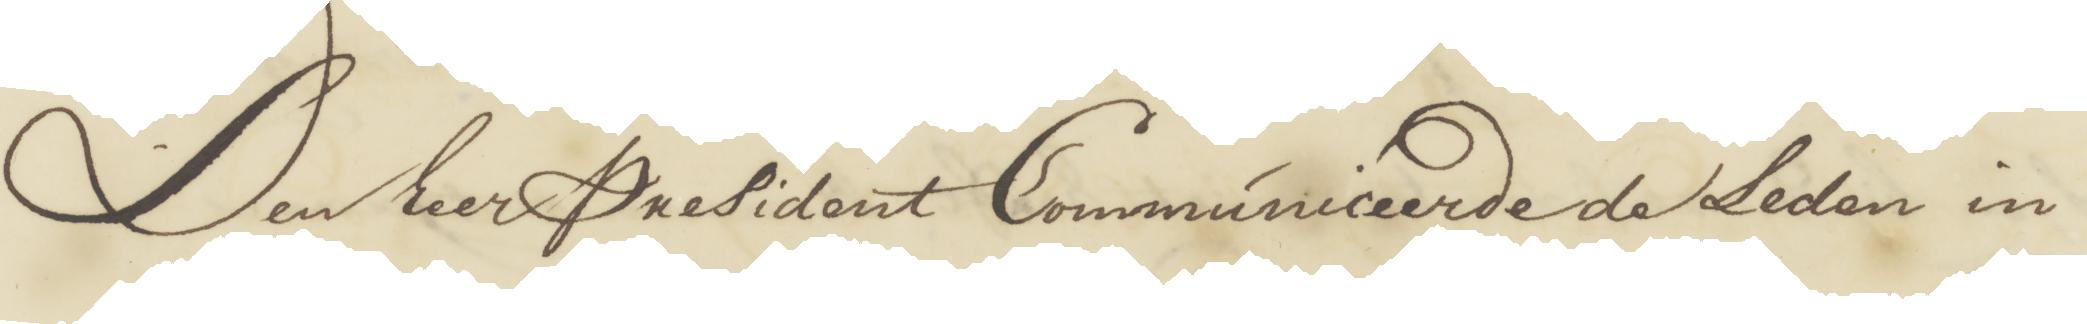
Den heer President Communiceerde de Leden in
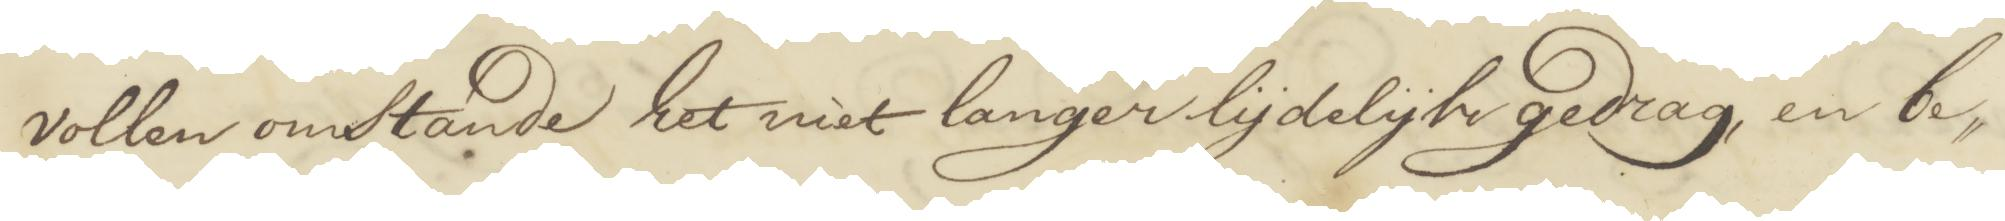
vollen omstande het niet langer lijdelijk gedrag, en be„
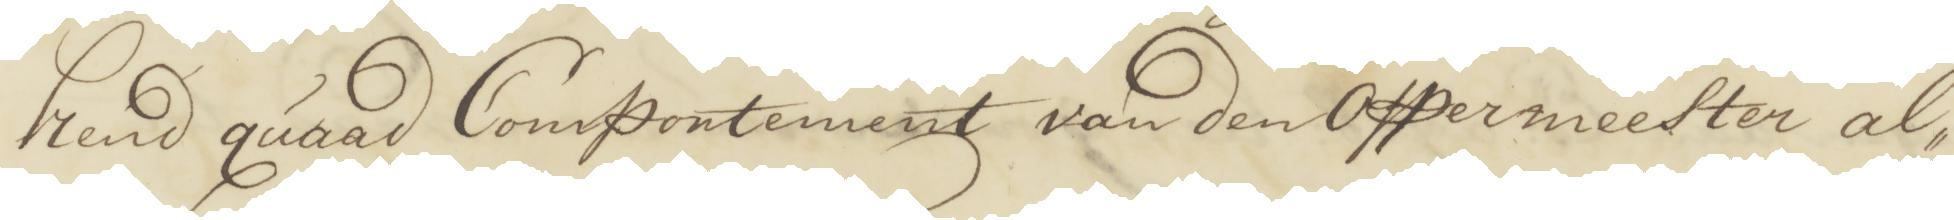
kend quaad Comportement van den oppermeester al„
